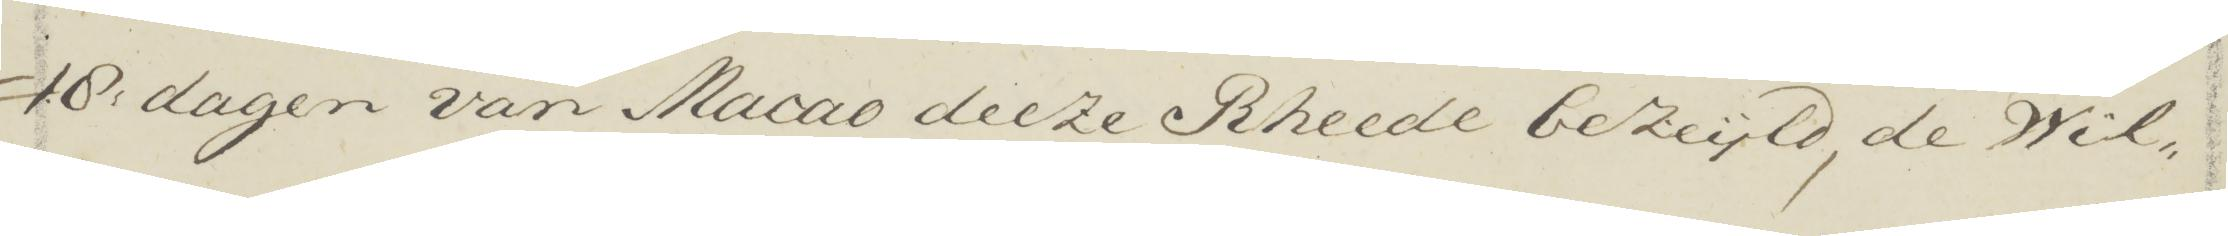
=18: dagen van Macao deeze Rheede bezeijld, de Wil„
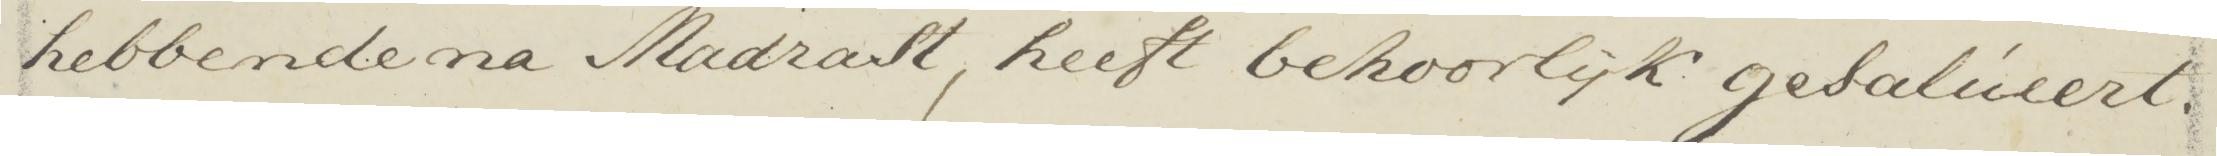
hebbende na Madrast, heeft behoorlijk gesalueert.
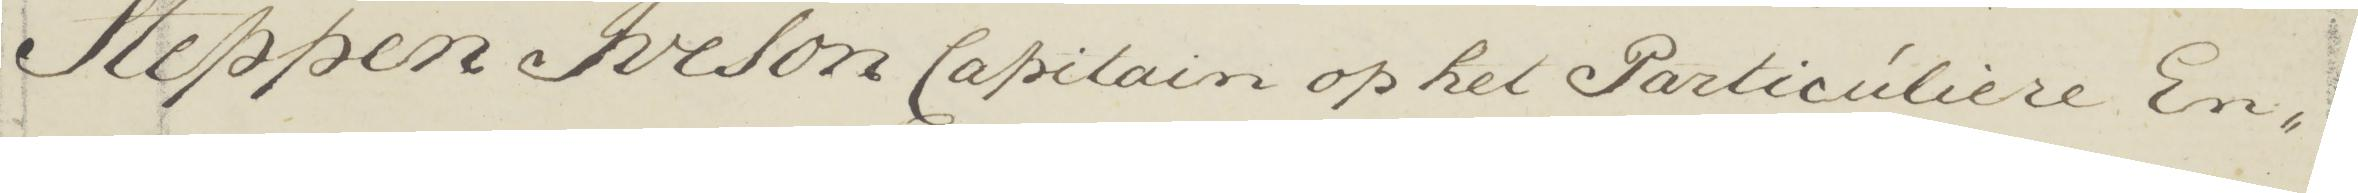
3: _„o Steppen Jveson Capitain op het Particuliere En„
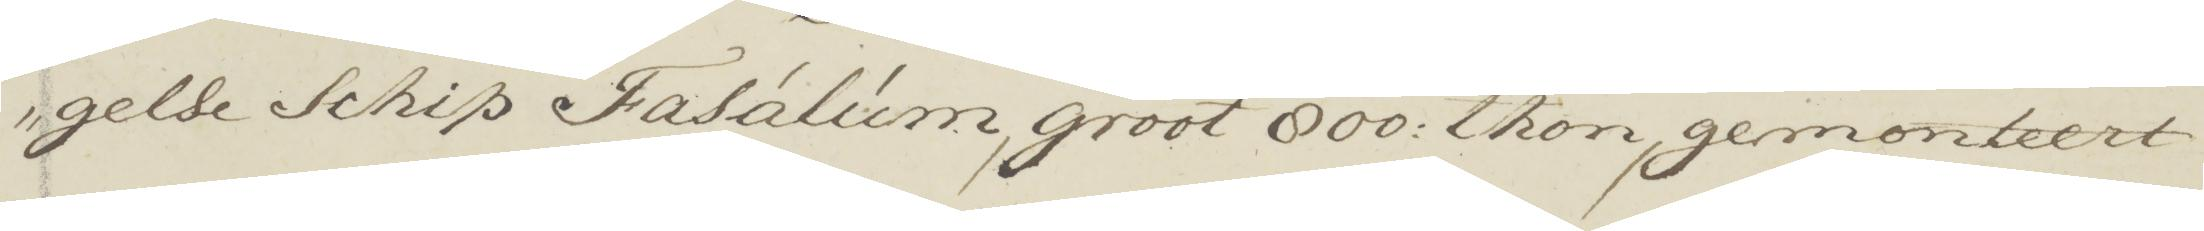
„gelse schip Fasalum, groot 800: thon, gemonteert
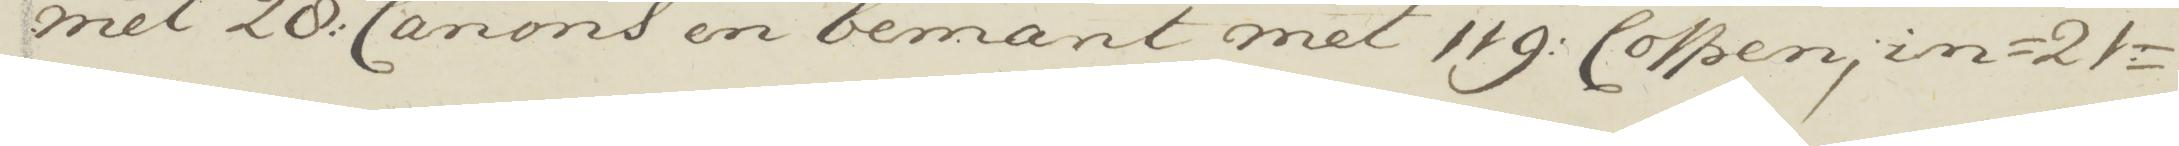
met 28: Canons en bemant met 119: Coppen, in =21=
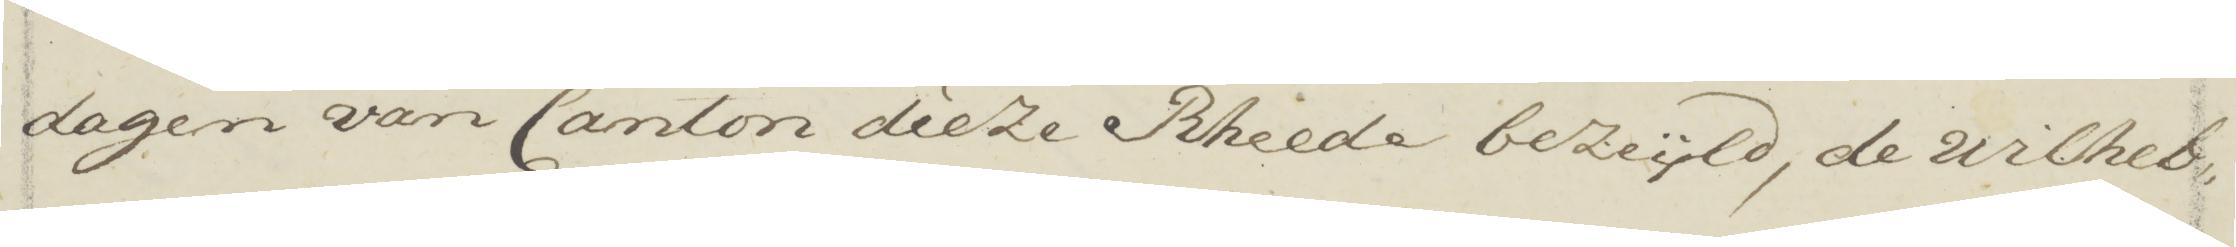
dagen van Canton deeze Rheede bezeijld, de wilheb„
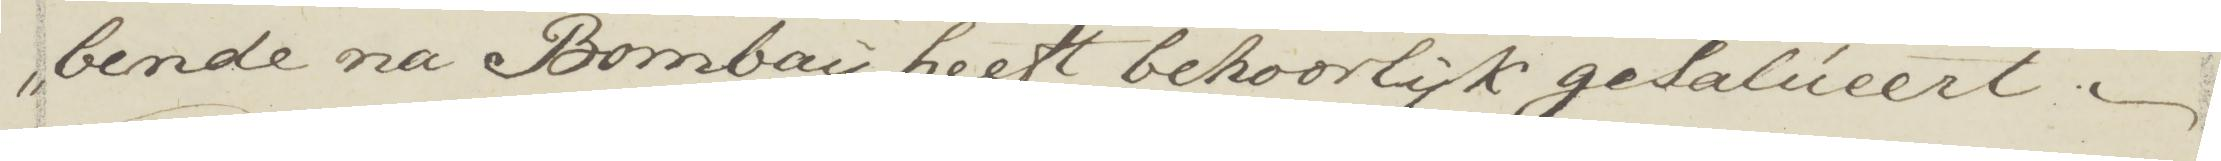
„bende na Bombaij, heeft behoorlijk gesalueert.
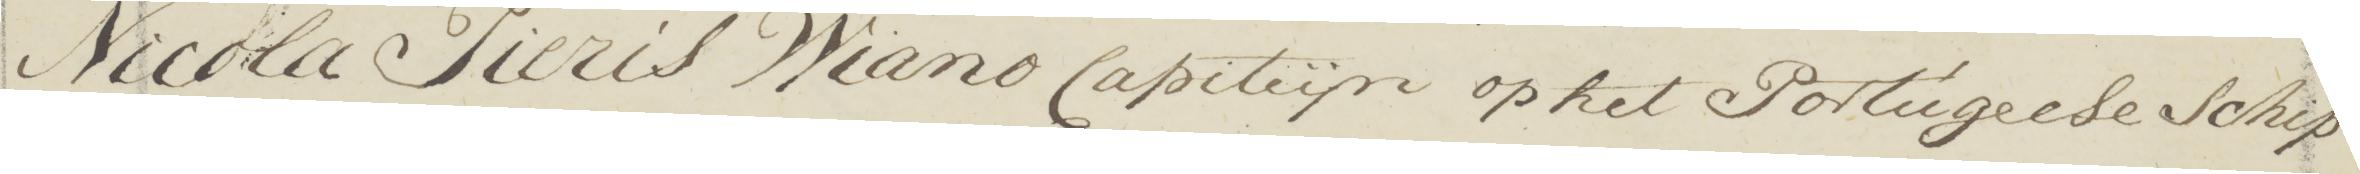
3: _„o Nicola Pieris Wiano Capiteijn op het Portugeese Schip
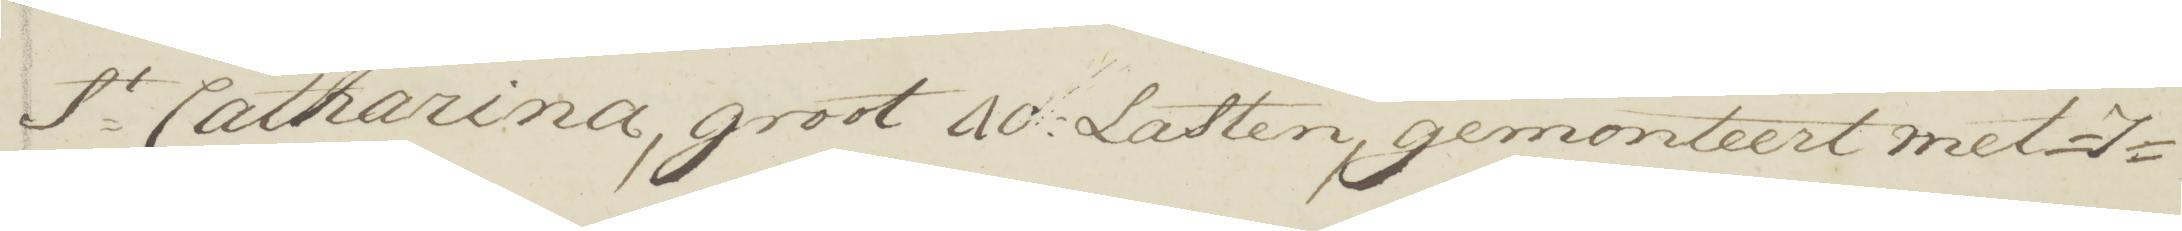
S=t Catharina, groot 40: Lasten, gemonteert met =7=
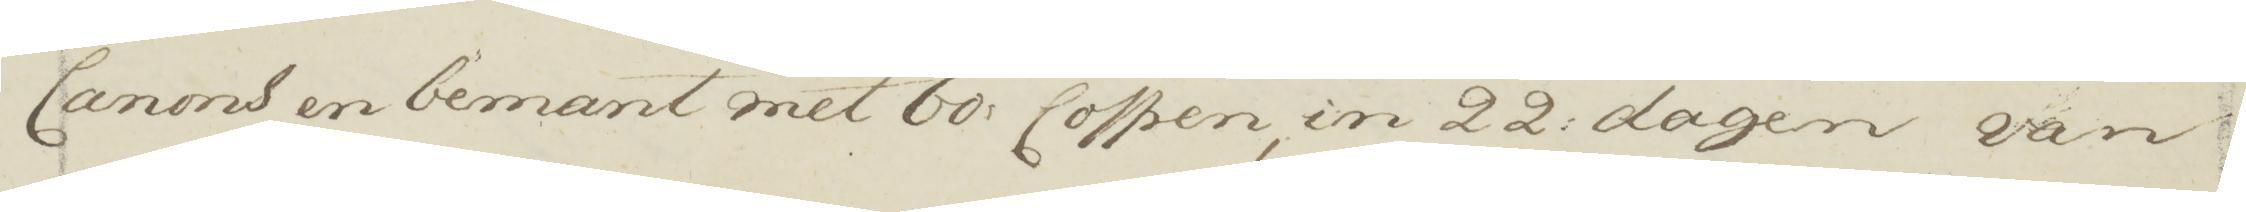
Canons en bemant met 60: Coppen, in 22: dagen van
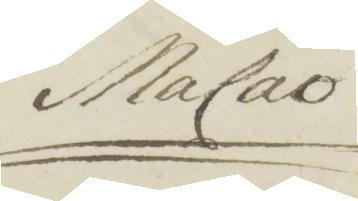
Macao
